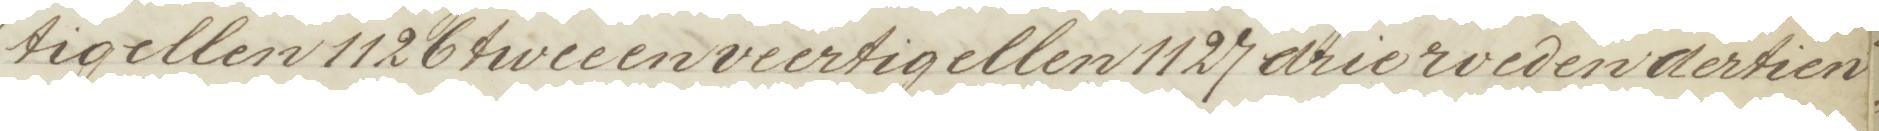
tig ellen 1126 twee en veertig ellen 1127 drie roeden dertien
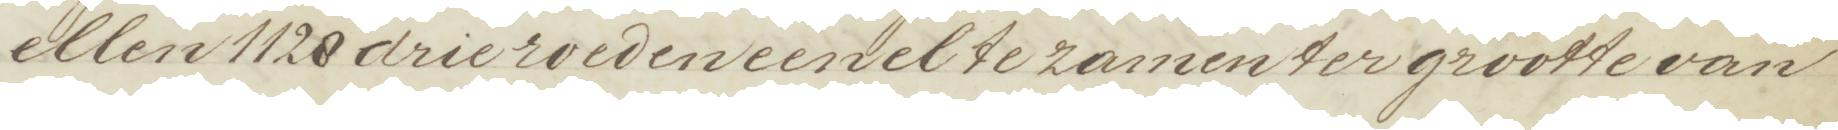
ellen 1128 drie roeden een el te zamen ter grootte van
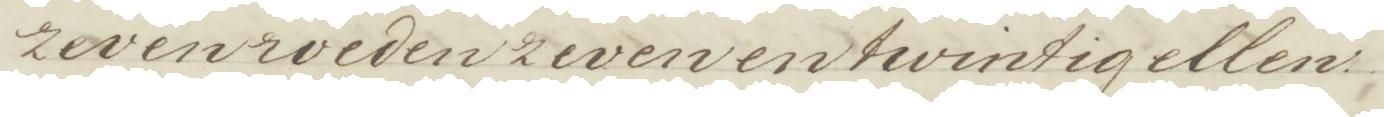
zeven roeden zeven en twintig ellen.
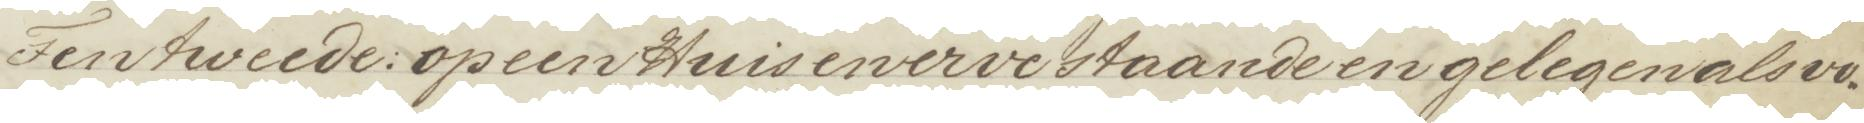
Ten tweede: op een Huis en erve staande en gelegen als vo„
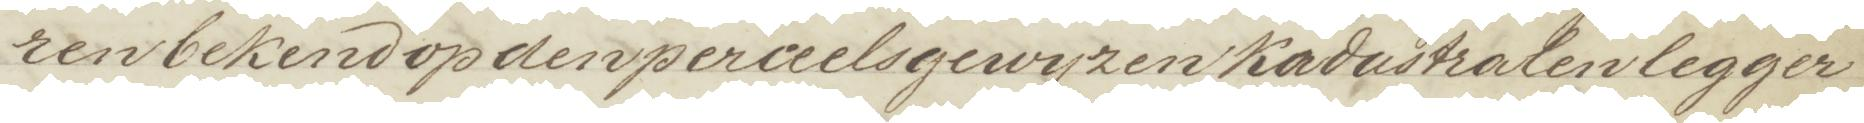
ren bekend op den perceelsgewyzen kadastralen legger
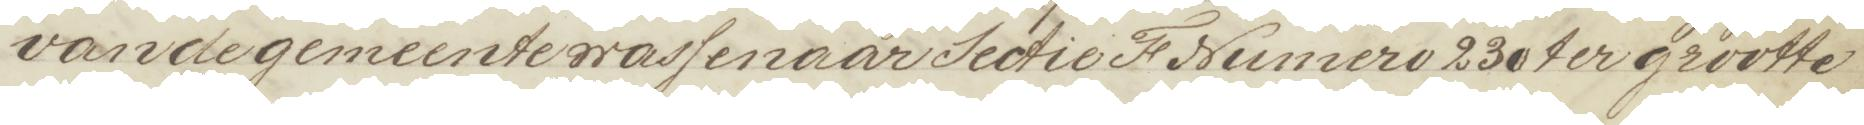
van de gemeente wassenaar Sectie F Numero 230 ter grootte
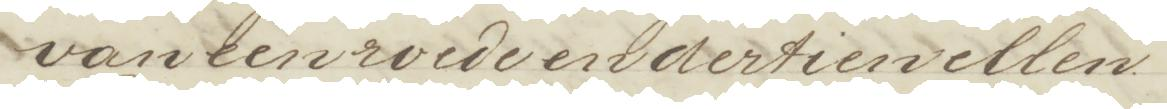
van een roede en dertien ellen.
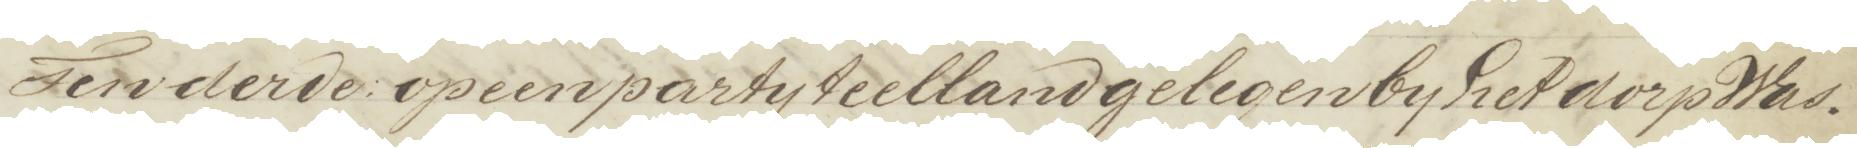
Ten derde: op een party teelland gelegen by het dorp Was„
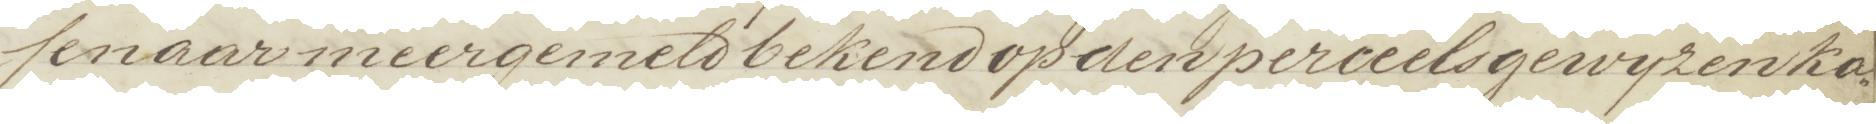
senaar meergemeld bekend op den perceelsgewyzen ka„
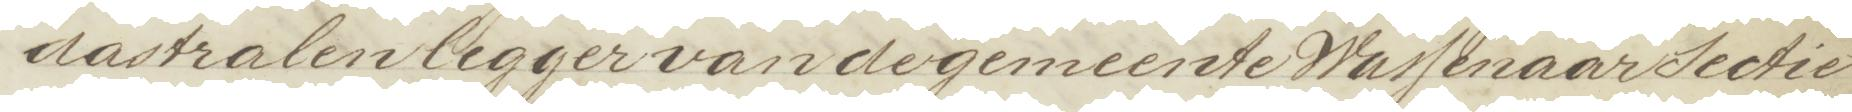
dastralen legger van de gemeente Wassenaar Sectie
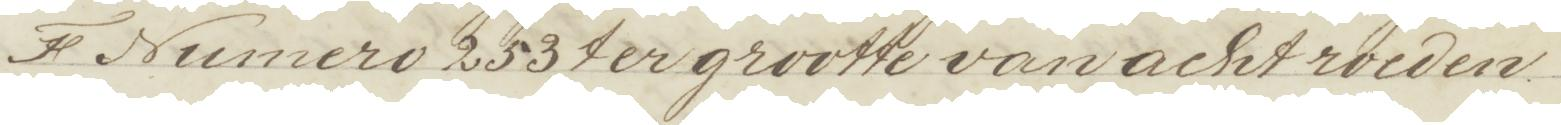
F Numero 253 ter grootte van acht roeden.
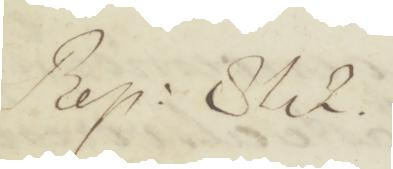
Rep: 842.
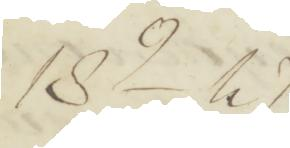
18 -9 47
